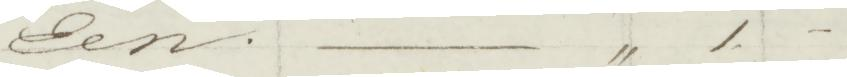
Een.— „ 1 —
